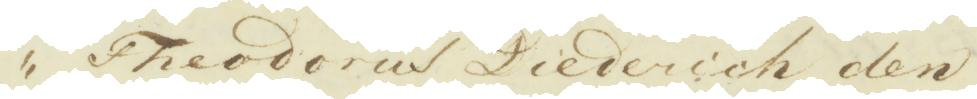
„ Theodorus Diederich den
